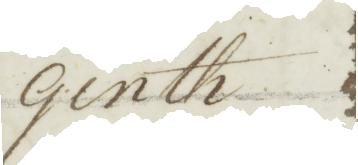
genth
